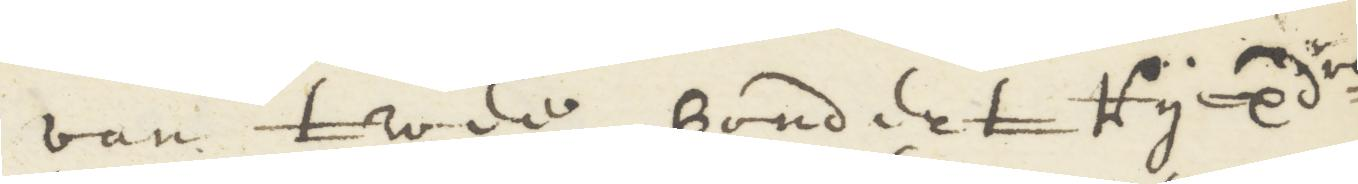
van twee hondert Rijcxdr
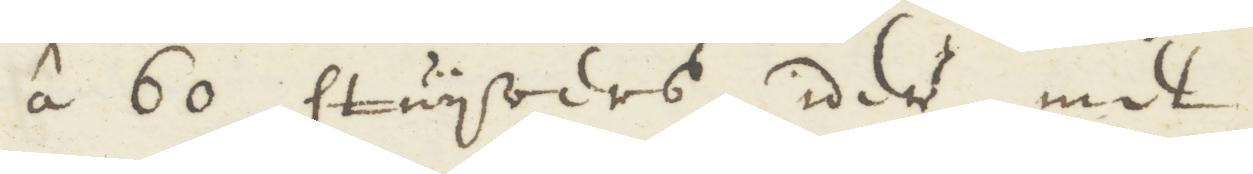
â 60 stuijvers ider met
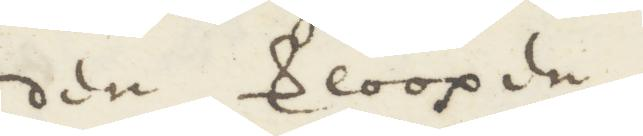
den verloopen
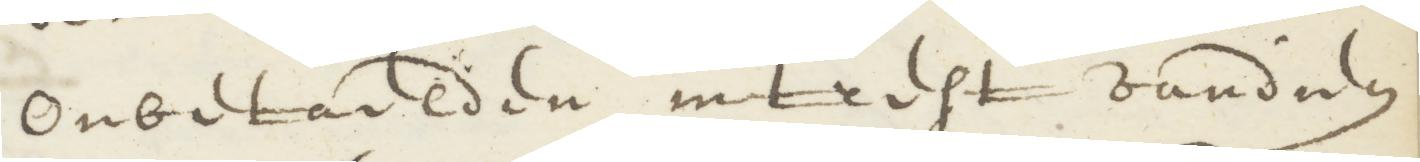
onbetaelden intrest vandien
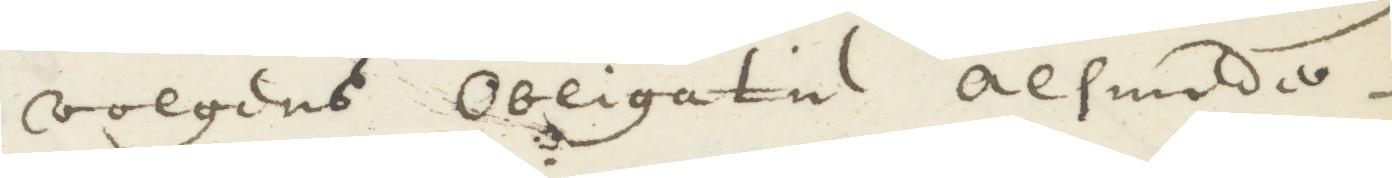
volgens obligatie alsmede
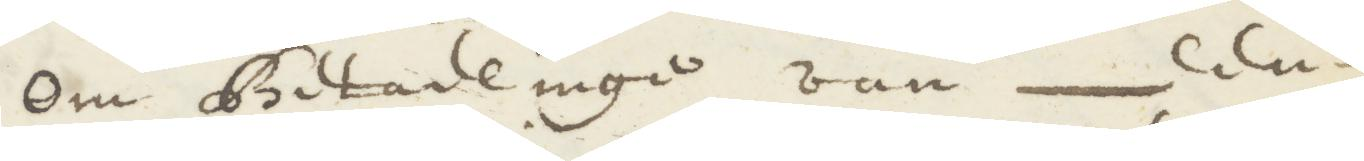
om Betaelinge van een
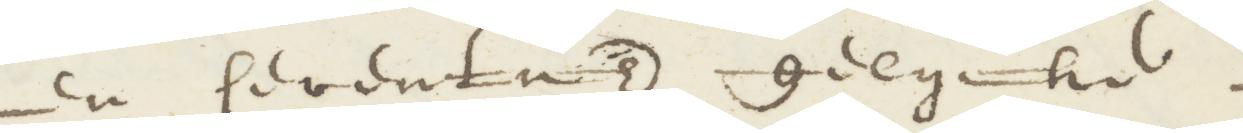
en seventich gelijcke
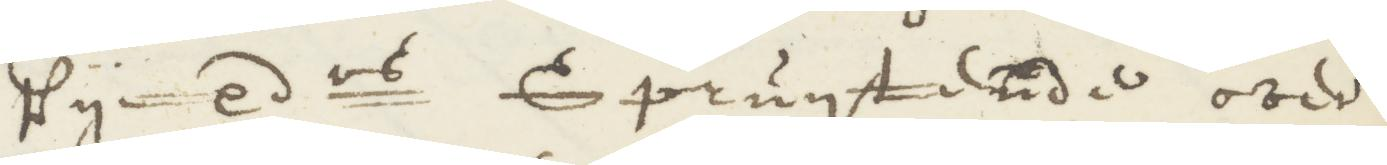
Rijcxd=rs Spruijtende over
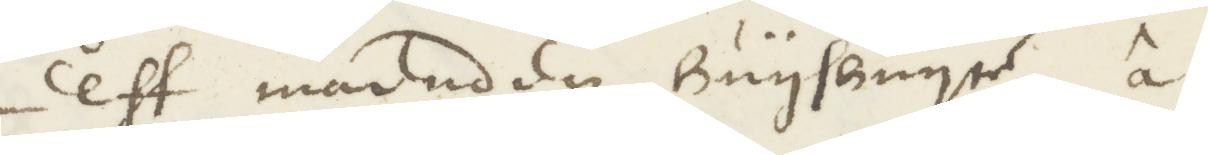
elff maenden huijshuijr â
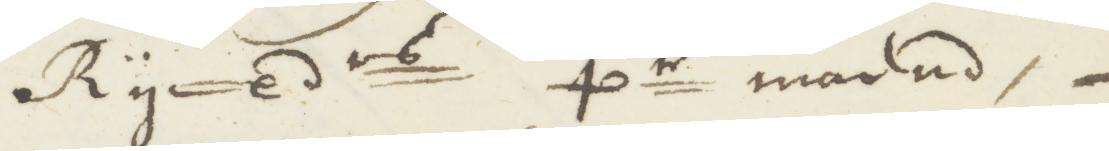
Rijcxd=rs p=r maend, -
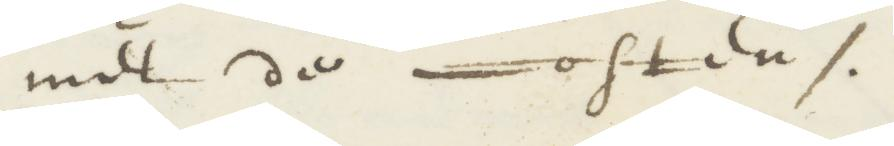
met de costen/.
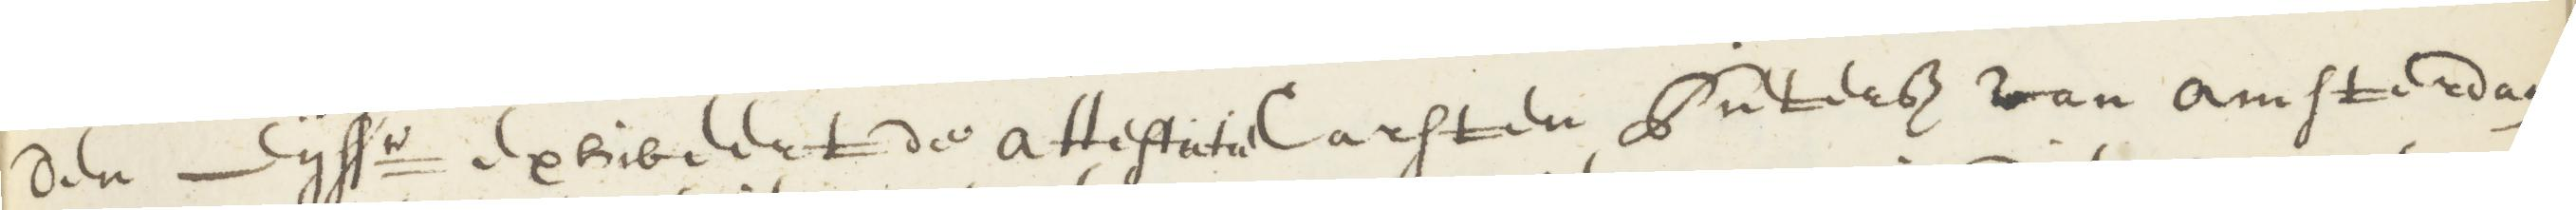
den Eijss=r exhibeert de attestatie Carsten Pietersz van amsterdam
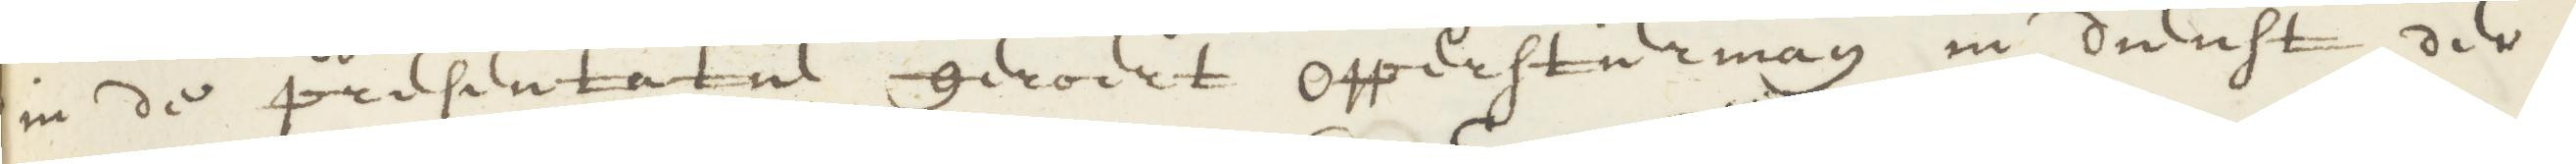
in de presentatie geroert opperstierman in dienst der
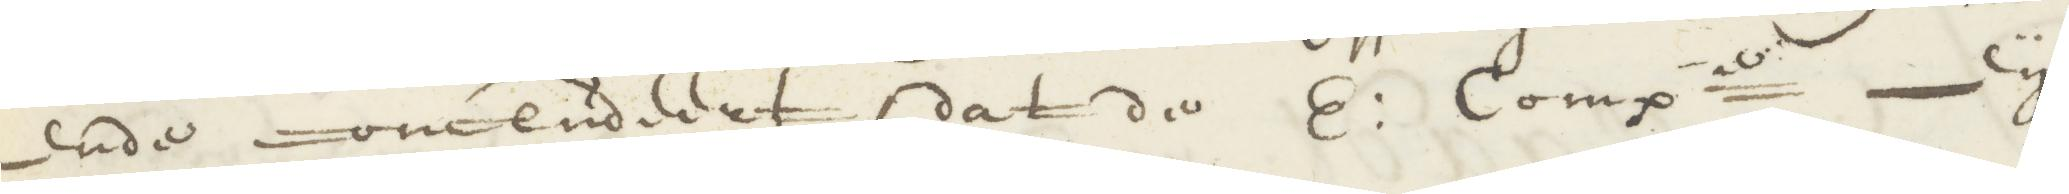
ende concludeert, dat de E: Comp=e eij
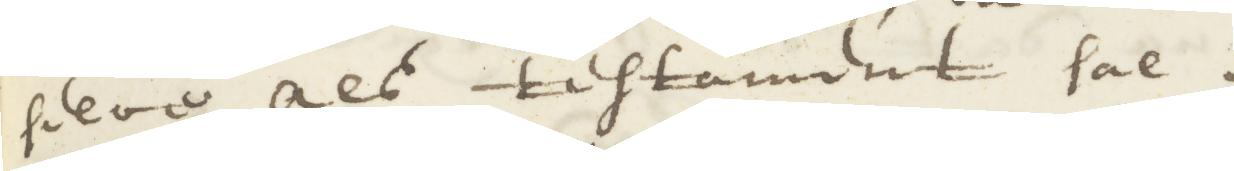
selve als testament sal
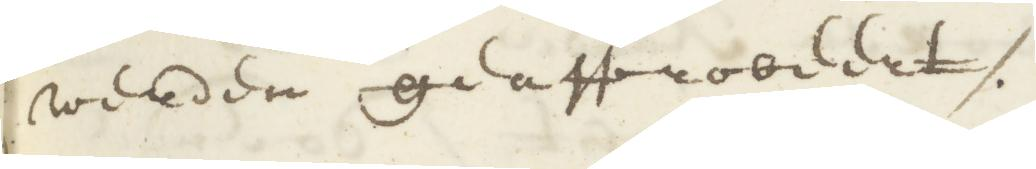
werden geapprobeert/.
